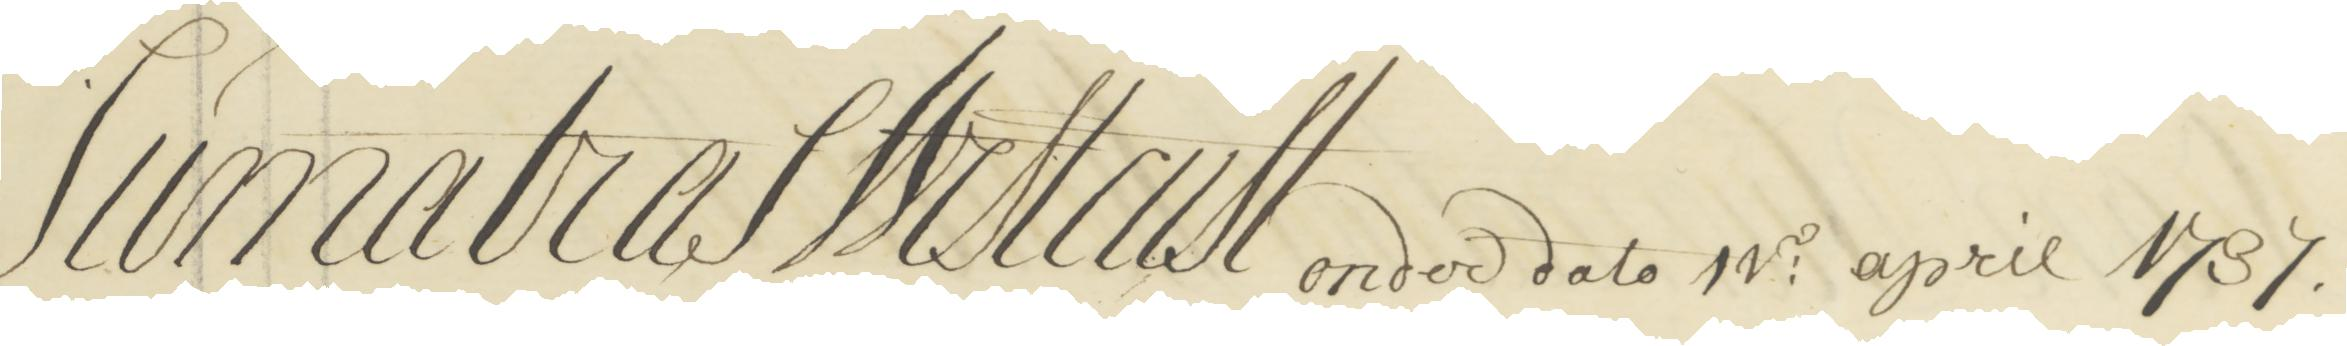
Sumatras Westcust onder dato 11:' april 1737.
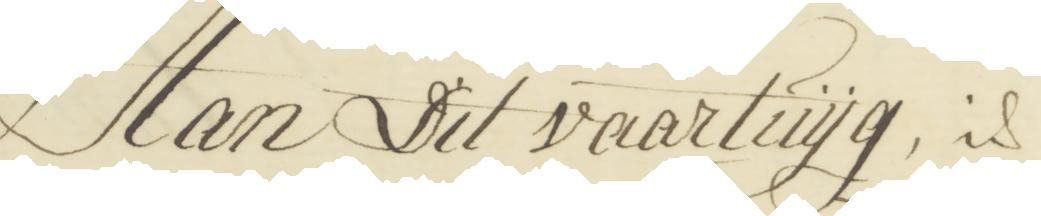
Aan Dit vaartuijg, is
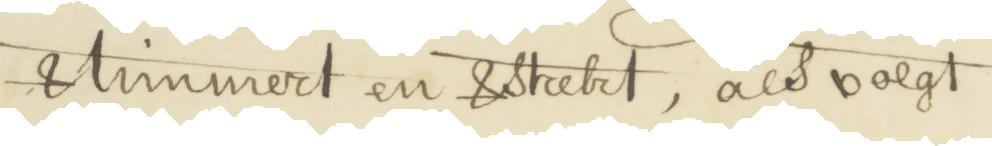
vertimmert en verstekt, als volgt
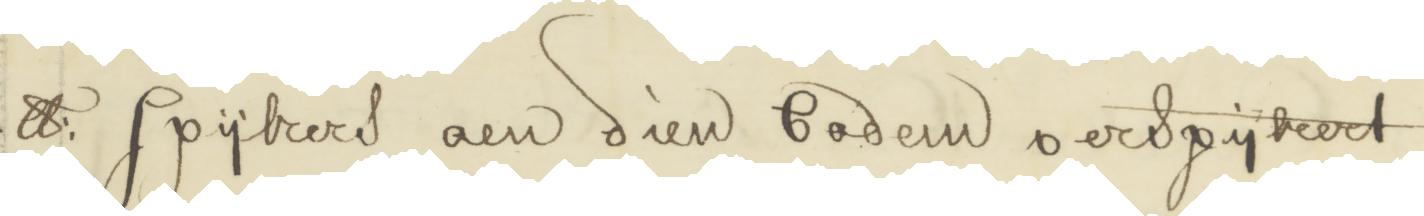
1736 7ber: 10: – lb: spijkers aen dien bodem verspijkert
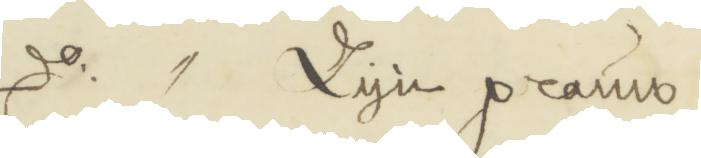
10. – „ _:o zijn prauw _:o
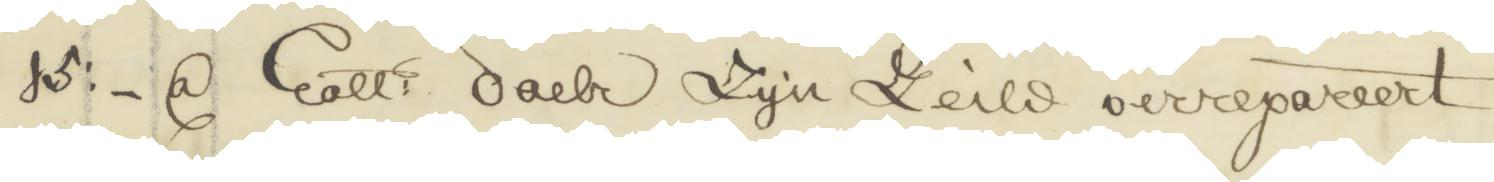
15: – @ hall:s doek zijn zeile verrepareert
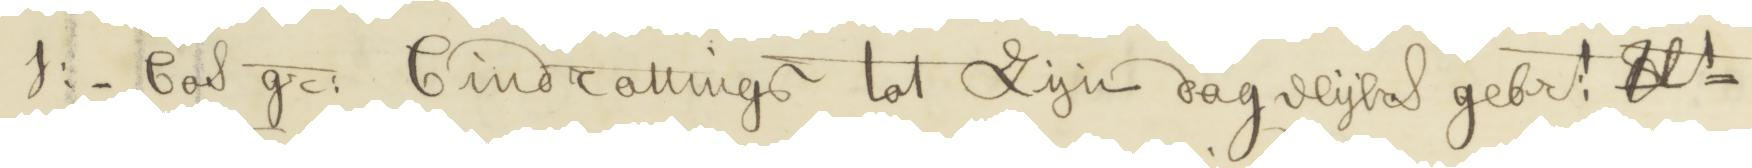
1: – bos gc: bindrottings tot zijn dagelijks gebr:t verl=t
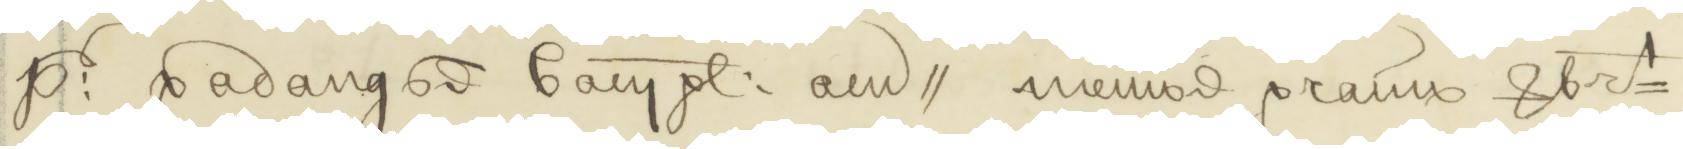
10: – p:s padangse baeypl: aen „ nieuwe prauw verbr=t
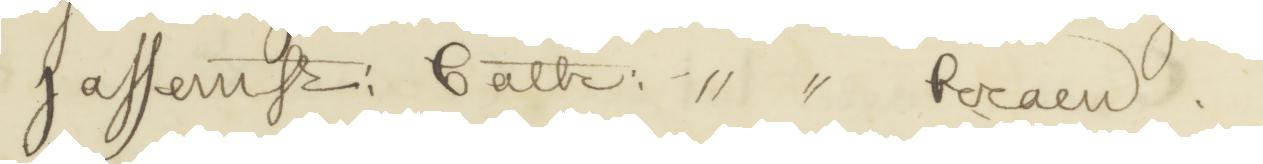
1: – „ Jassemsz: balk: – „ „ kraen . . . _:o
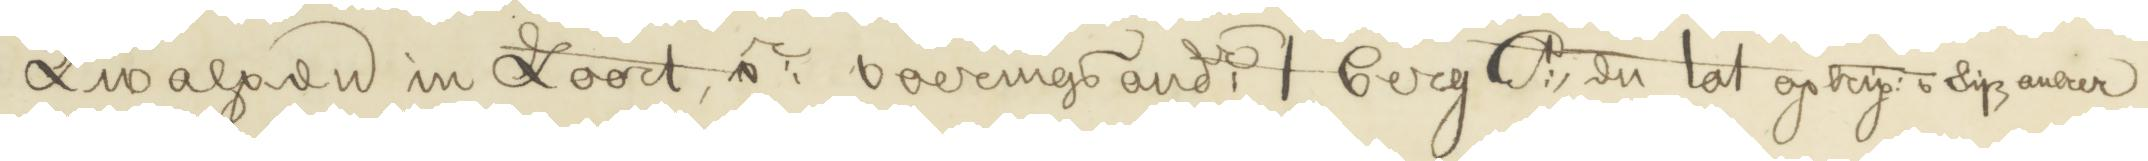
1: – „ zwalpen in zoort, p:r voerings and:r 't berg h:t, en tot op kip:s sijn anker
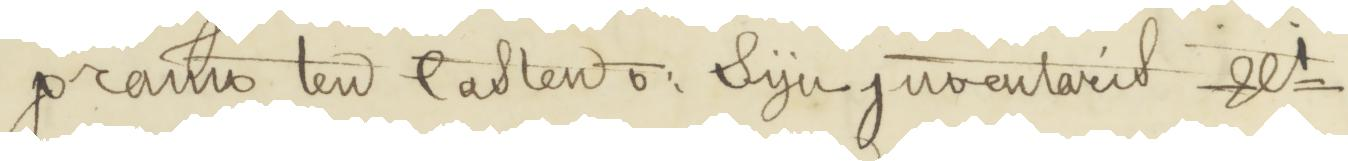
1: – „ prauw ten lastens v: sijn jnventaris verl=t
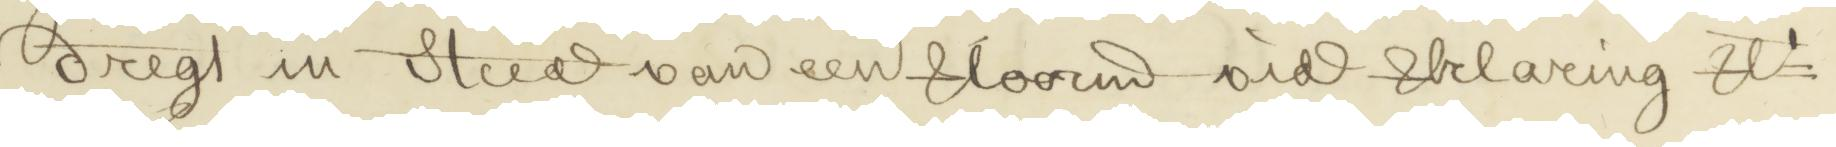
8ber: 1: – „ dregt in steede van een vertoornd vide verklaring verl=t
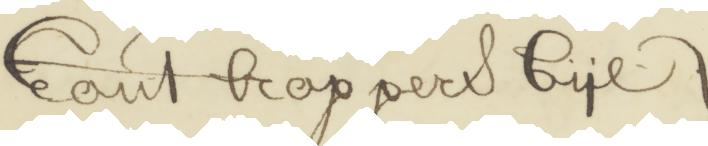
1: – „ hout kappers bijl
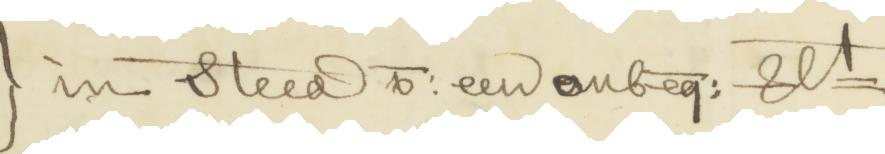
in steed v: een onbeq: verl=t
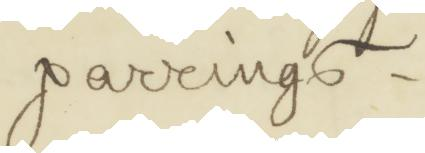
1: – „ parrings
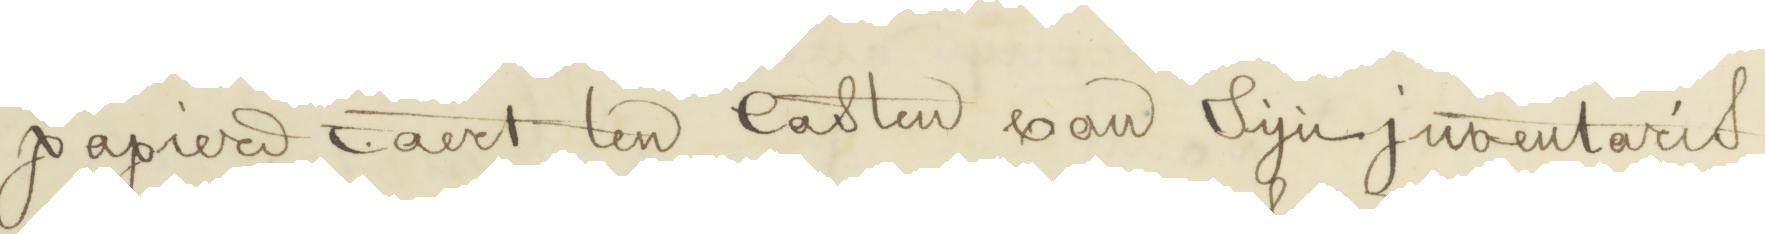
1: – „ papiere caert ten lasten van sijn jnventaris
